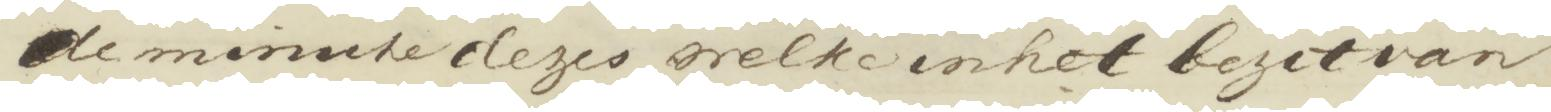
de minute dezes welke in het bezit van
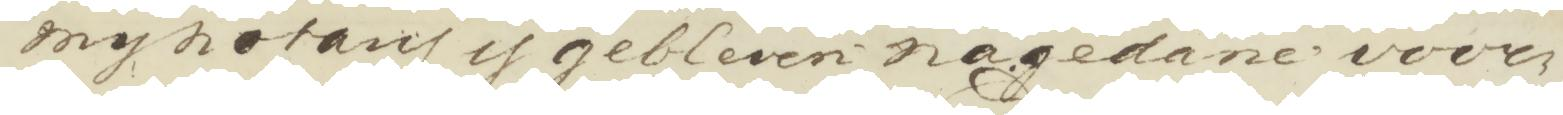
my notaris is gebleven na gedane voor
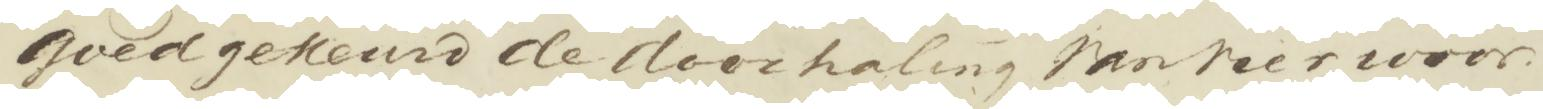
goed gekeurd de doorhaling van vier woor.
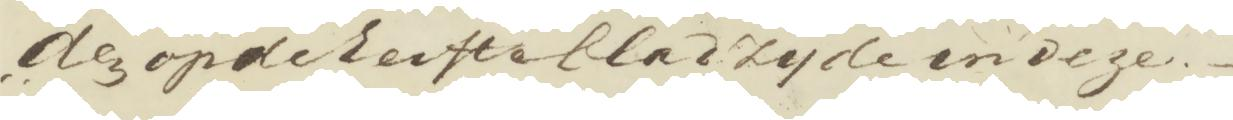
,den op de Eerste bladzyde in deze. —
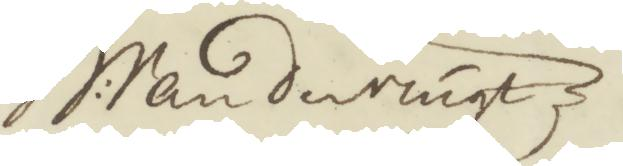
W: Van der vrugt
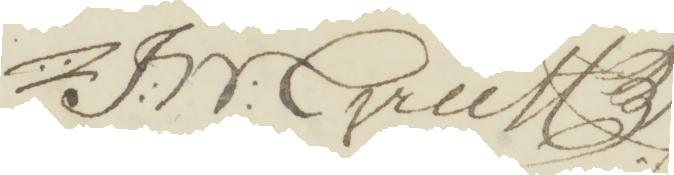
J: W: Greeff
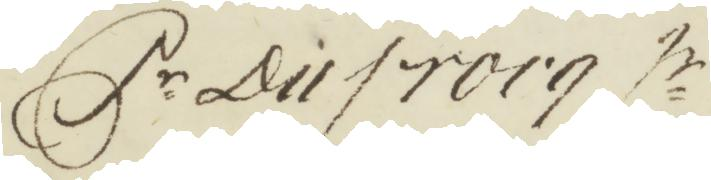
P:r Du Crocq J=r
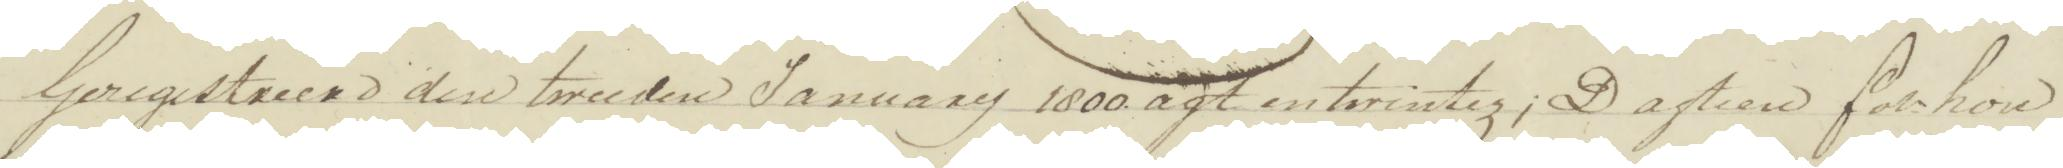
Geregistreerd den tweeden Ianuary 1800: agt en twintig; D agtien fol hon
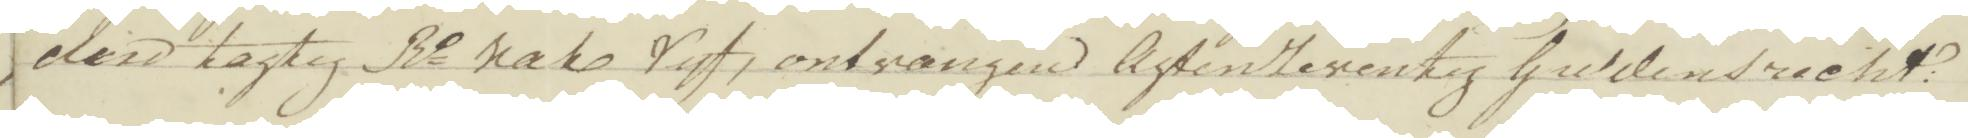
derd tagtig R=o vak Vyf, ontvangen Agtenzeventig Guldens recht:
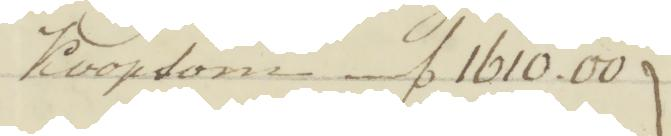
Koopsom - ƒ 1610. 00 }
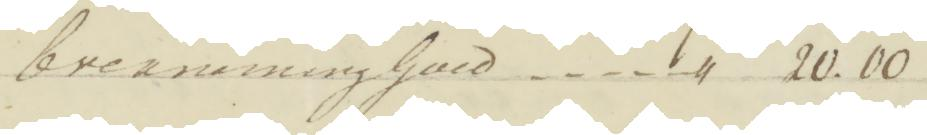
leverneming Goed - - - - - „ 20. 00
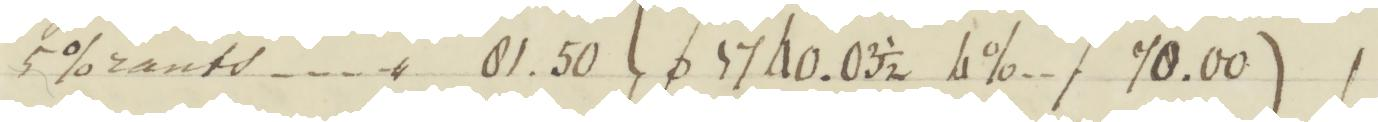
5% rants - - - - „ 81. 50 ƒ 1740. 03½ 4% - - ƒ 78. 00 }
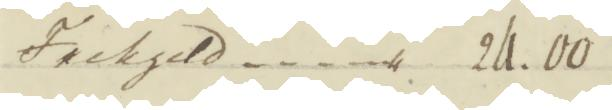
Trekgeld - - - - „ 24. 00
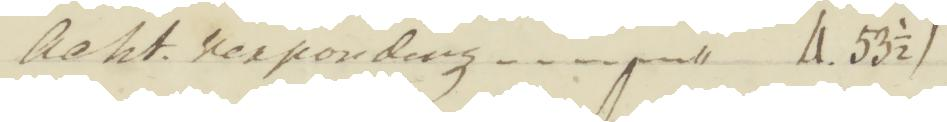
Acht. verponding - - - - - - „ 4. 53½ }
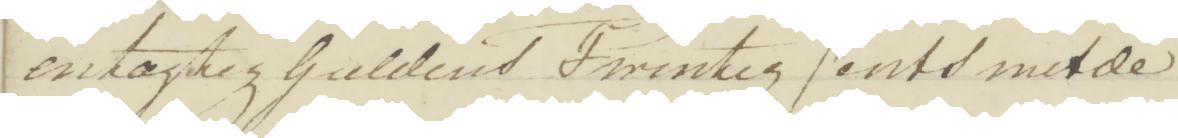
en tagtig Guldens Twintig Cents met de
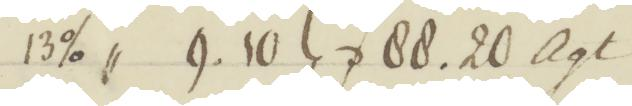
13% „ 9. 10 } ƒ 88. 20 Agt
